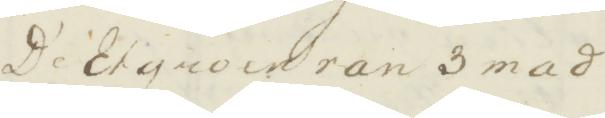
De Etgroen van 3 mad
